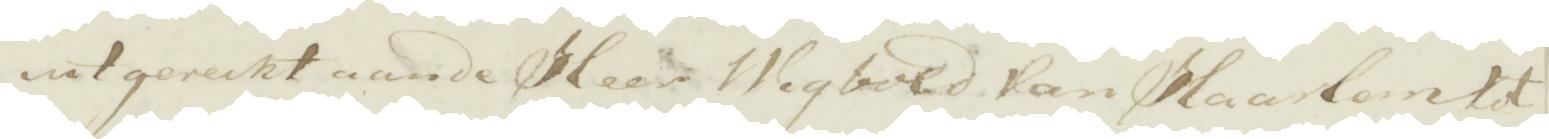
uitgereikt aan de Heer Wigbold van Haarlem tot
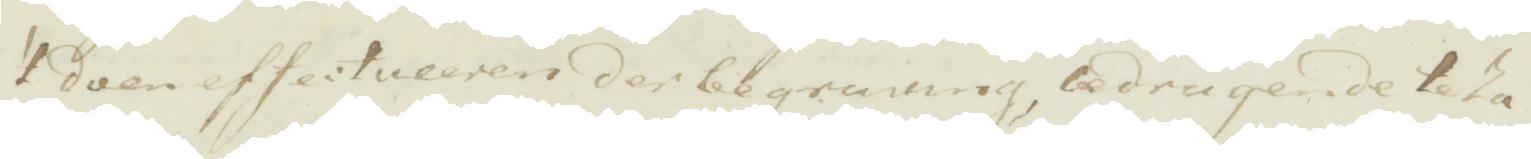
't doen effectueeren der begraving, toedragende te za
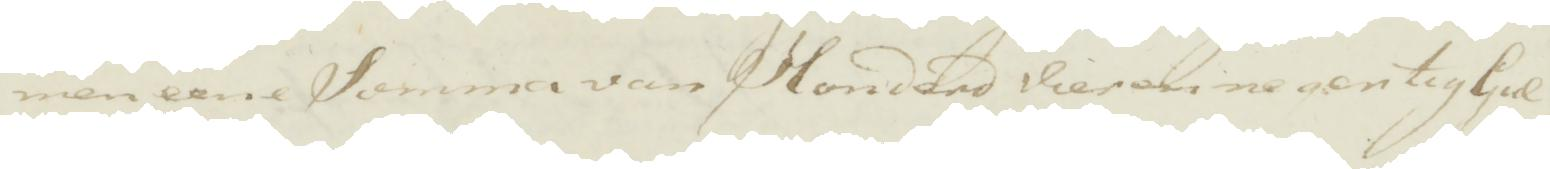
men eene somma van Honderd vierennegentig Gul
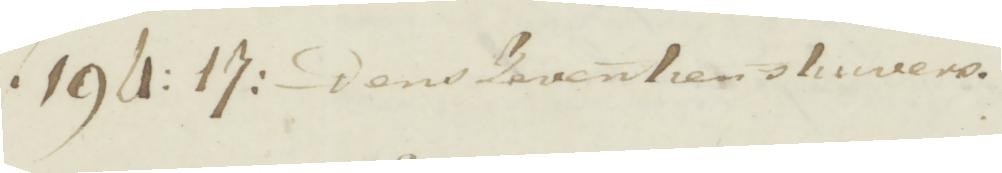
ƒ 194: 17: dens Zeventien stuivers.
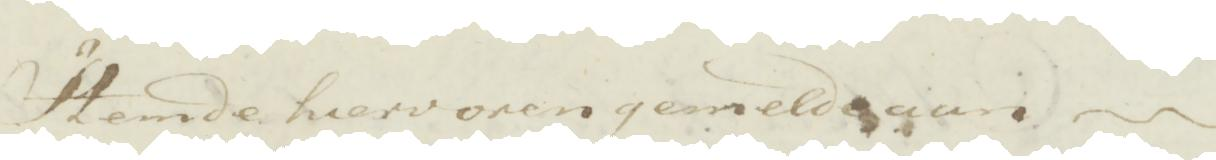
Hem de hiervoren gemelde aan
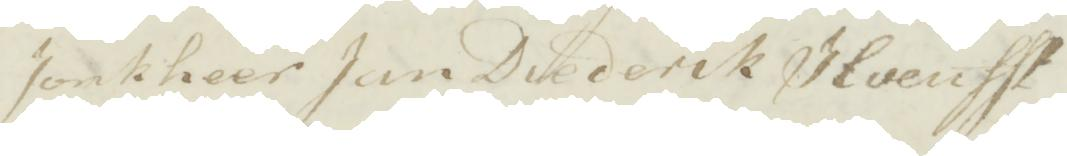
Jonkheer Jan Diederik Hoeufft
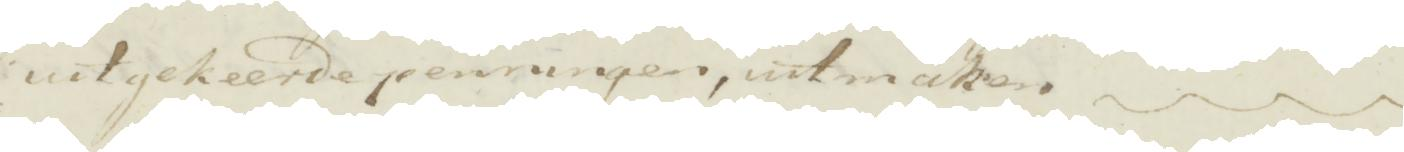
uitgekeerde penningen, uitmaken
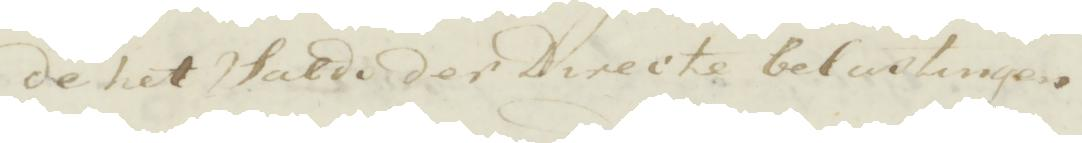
de het saldo der Directe belastingen
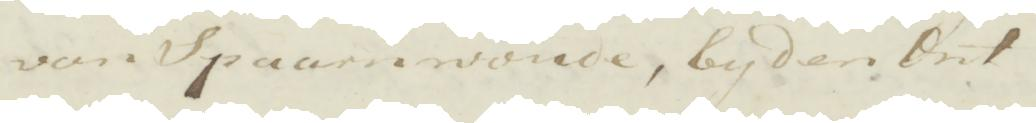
van spaarnwoude, bij den Ont
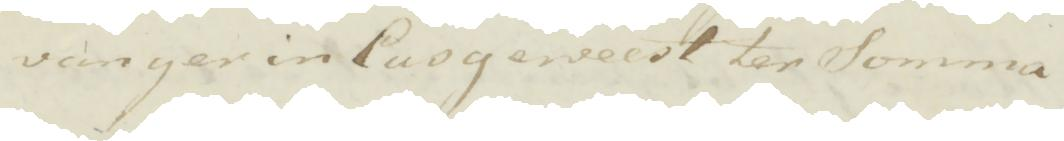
vanger in cas geweest ter somma
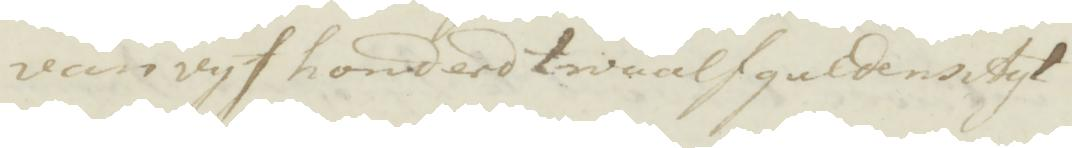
van vijf honderd twaalf guldens Agt
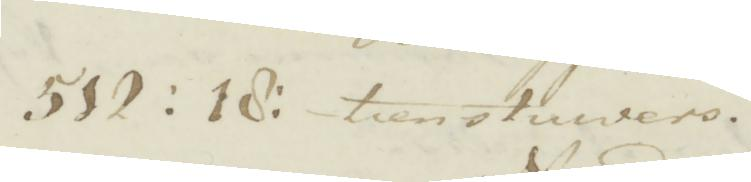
512: 18: tien stuivers.
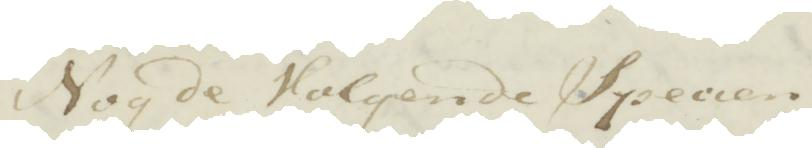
Nog de volgende specien
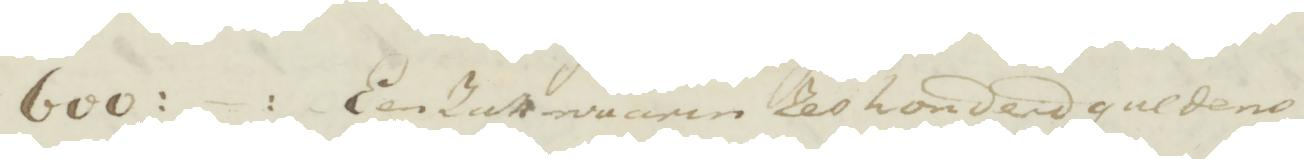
600: — : Een zak waaren zes honderd guldens
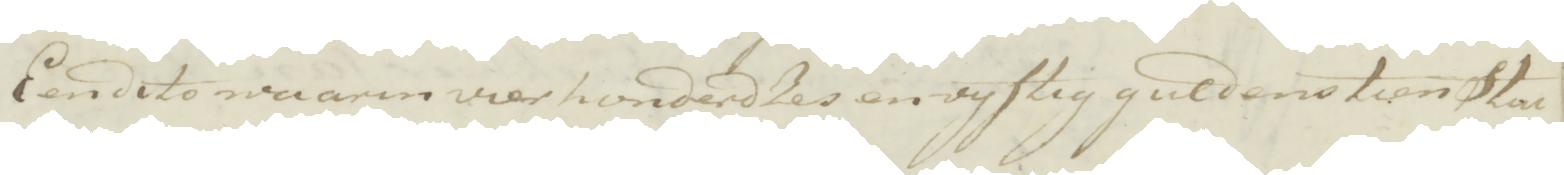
Een dito waaren vier honderd zes en vijftig guldens tien stui
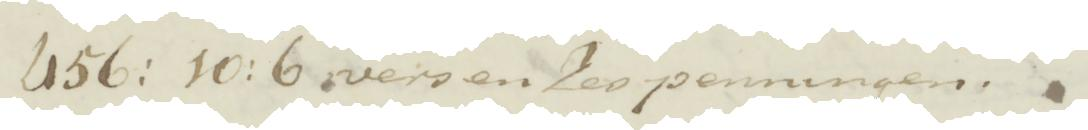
456: 10: 6 vers en zes penningen.
